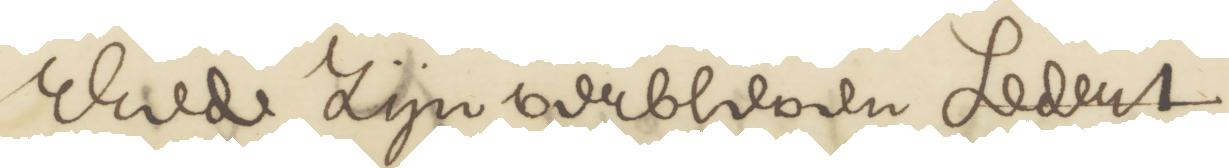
rhede zijn verbleven sedert
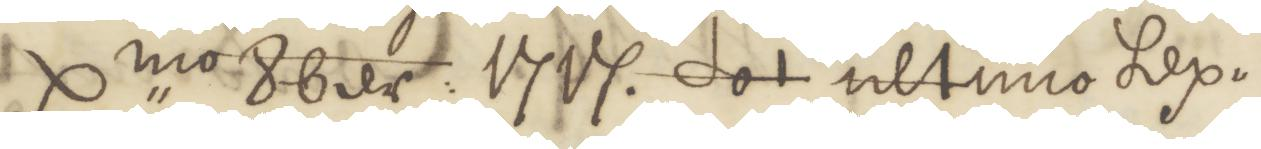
p„mo 8ber: 1717. tot ultimo sep„
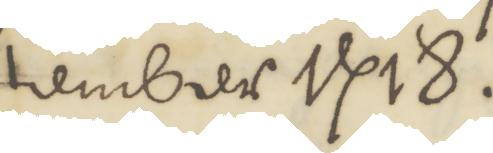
tember 1718.
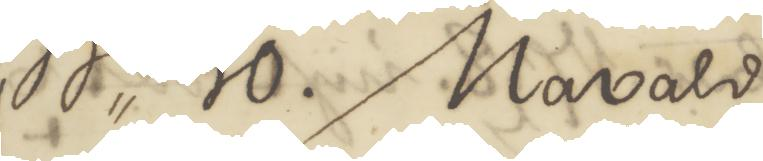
N„o 10. Navale
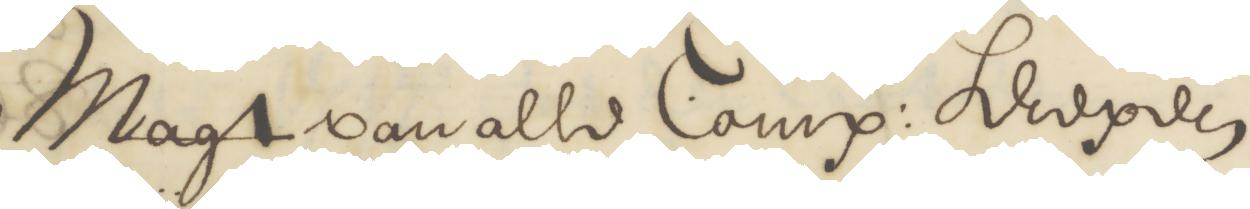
Magt van alle Comp:s schepen
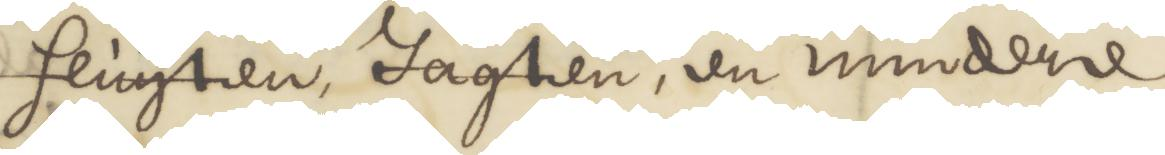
fluijten, Jagten, en mindere
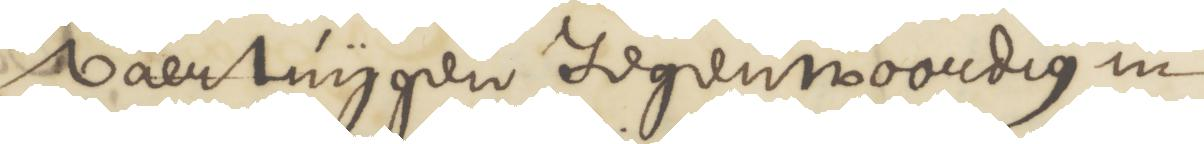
vaertuijgen tegenwoordig in
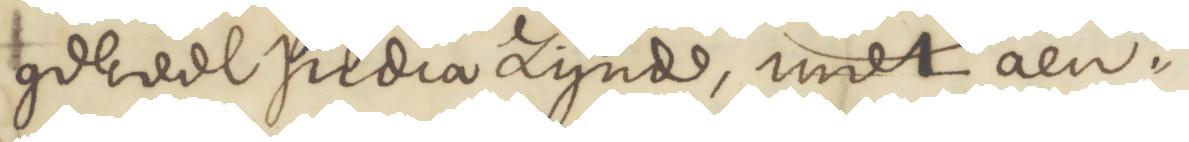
geheel India zijnde, met aen„
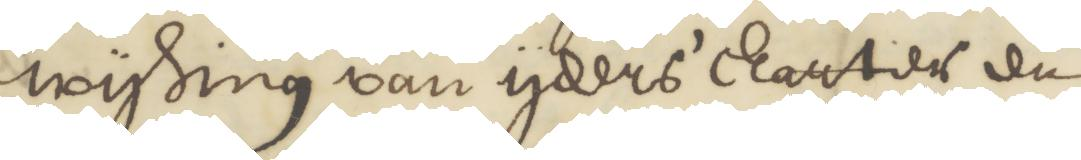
wijsing van ijders' charter en
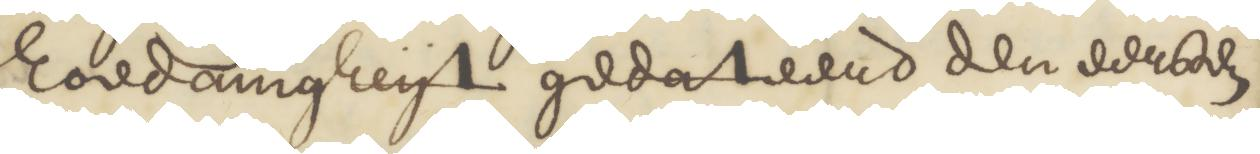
hoedanigheijt gedateerd den eersten
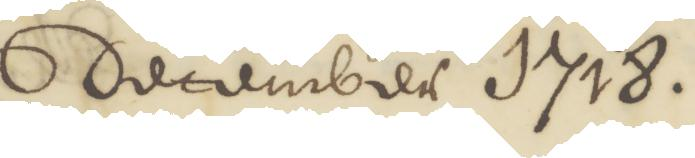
december 1718.
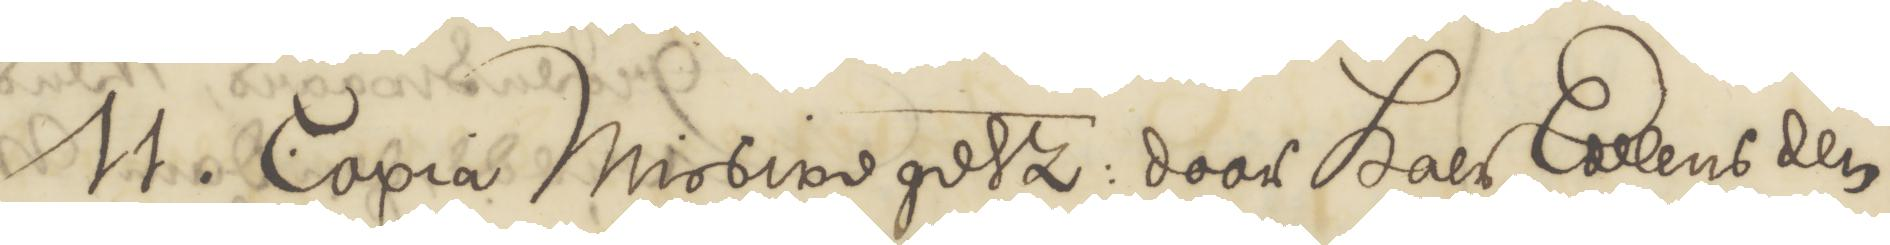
11. Copia Missive gesz: door Haer Edelens den
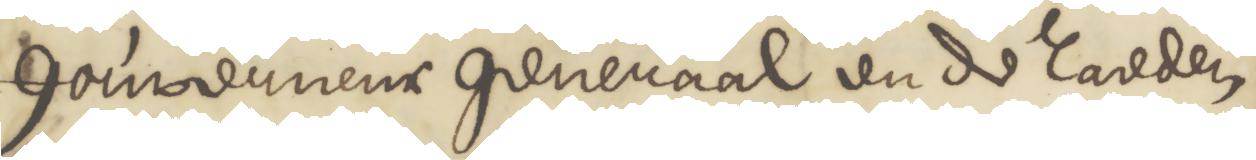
Gouverneur Generaal en de Raeden
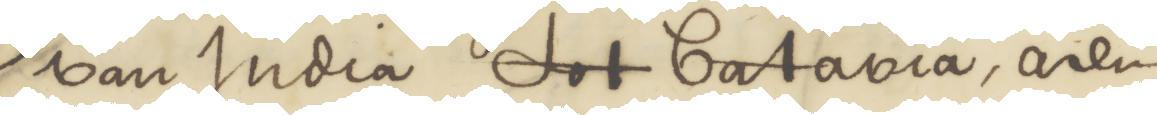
van India tot batavia, aen
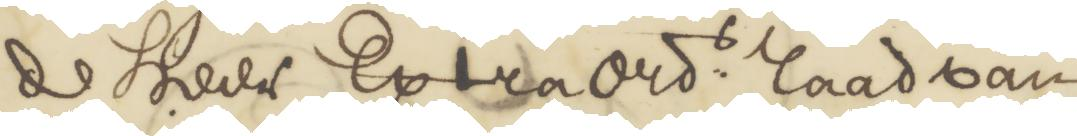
de Heer Extraord:s Raad van
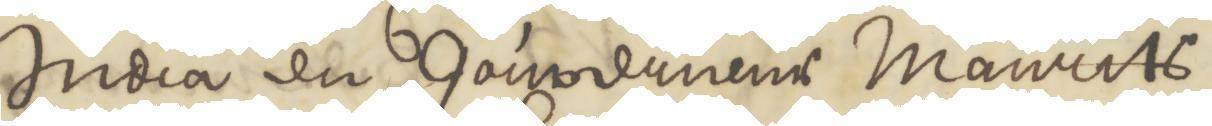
India en Gouverneur Maurits
